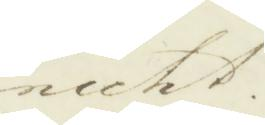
nicht
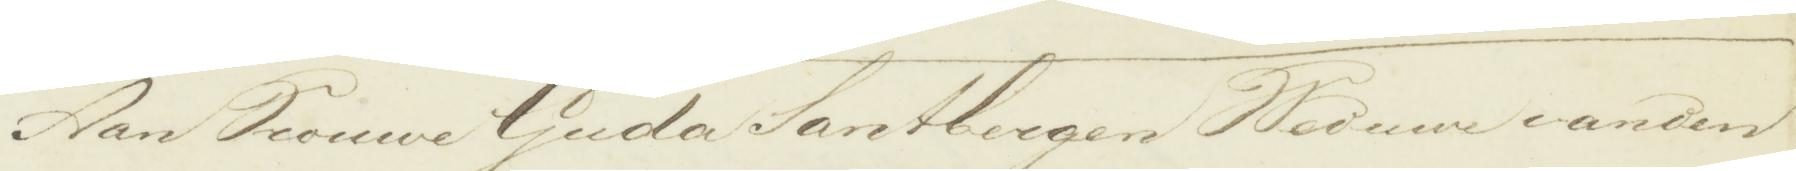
Aan Vrouwe Guda Santbergen Weduwe van den
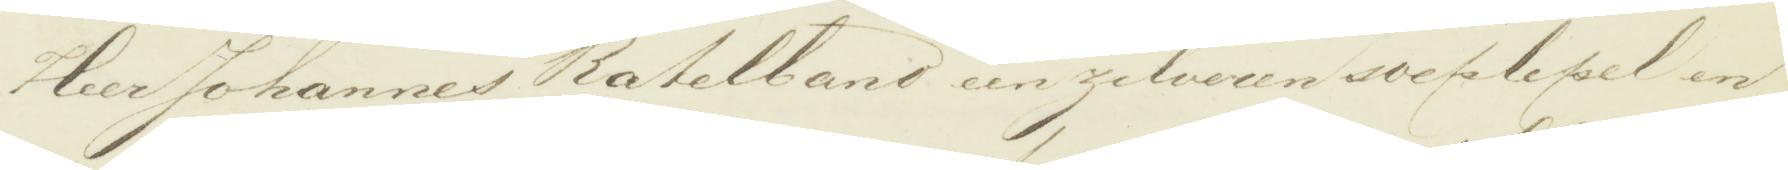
Heer Johannes Ratelband een zilveren soeplepel en
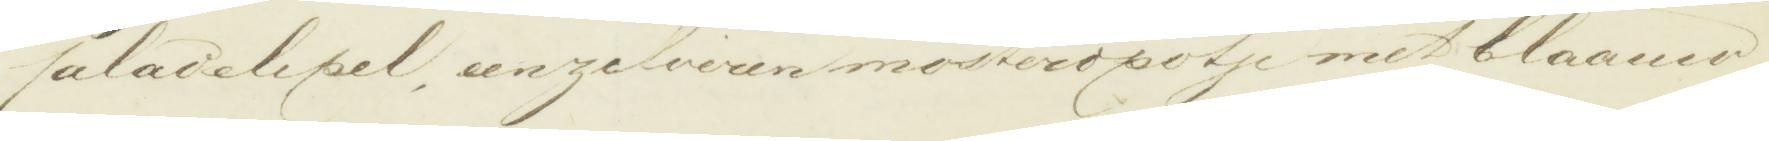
saladelepel, een zilveren mosterdpotje met blaauw
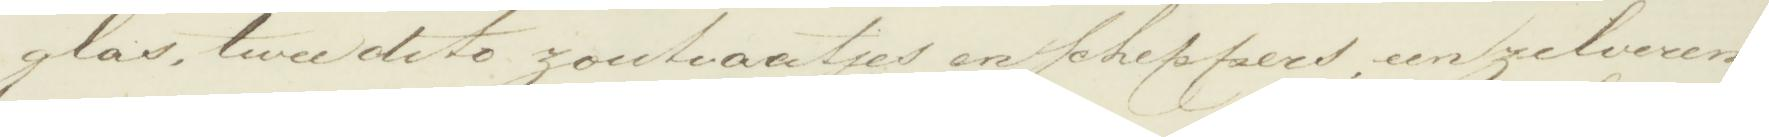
glas, twee dito zoutvaatjes en scheppers, een zilveren
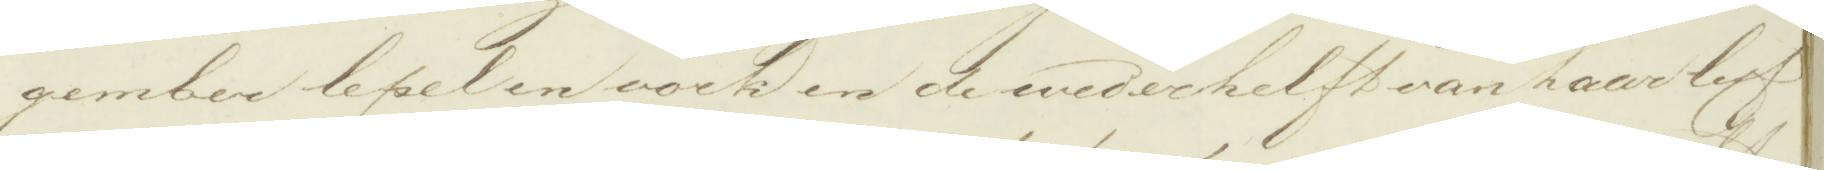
gember lepel en vork en de wederhelft van haar lyf
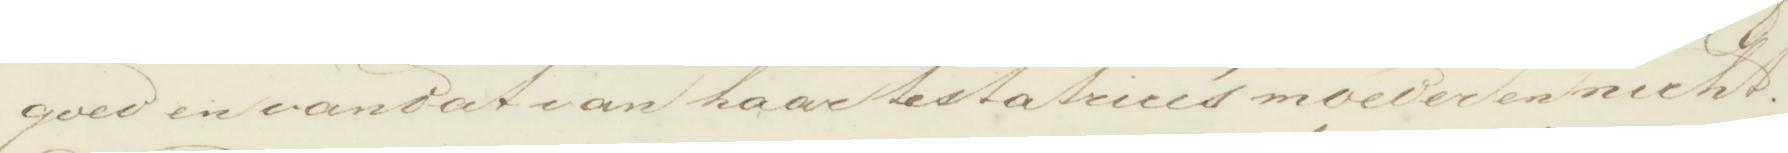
goed en van dat van haar testatrices moeder en nicht.
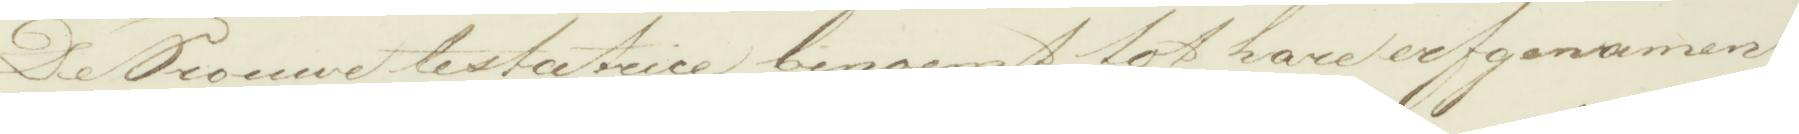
De Vrouwe testatrice benoemt tot hare erfgenamen
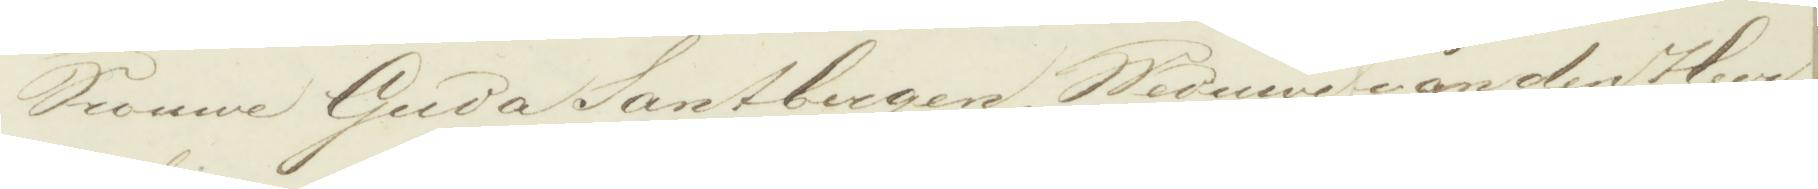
Vrouwe Guda Santbergen, Weduwe van den Heer
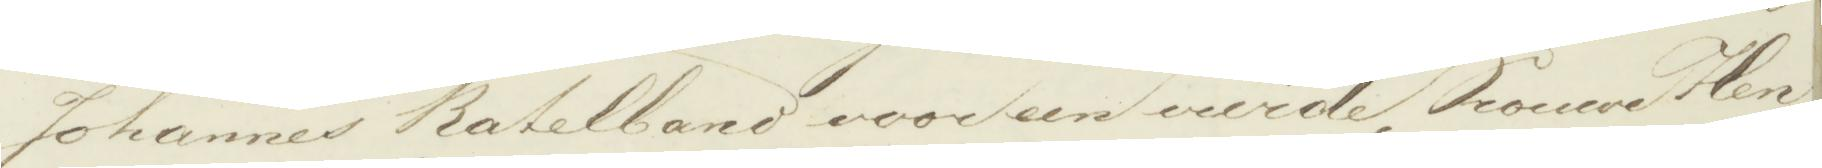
Johannes Ratelband voor een vierde, Vrouwe Hen
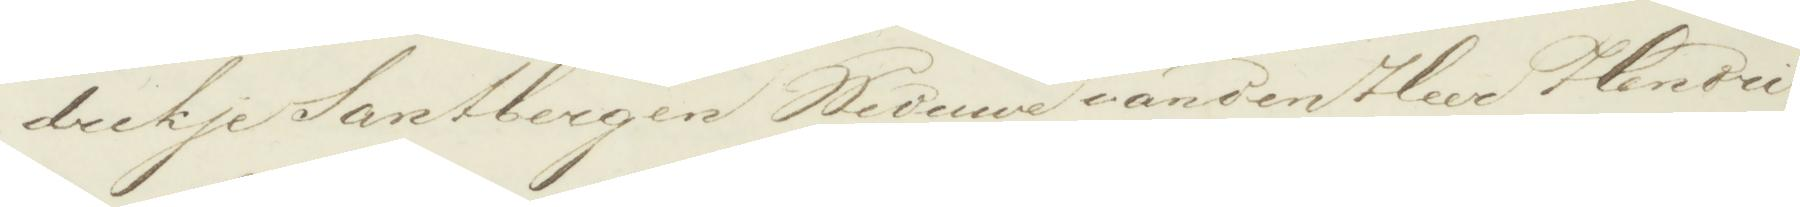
drikje Santbergen Weduwe aan den Heer Hendri
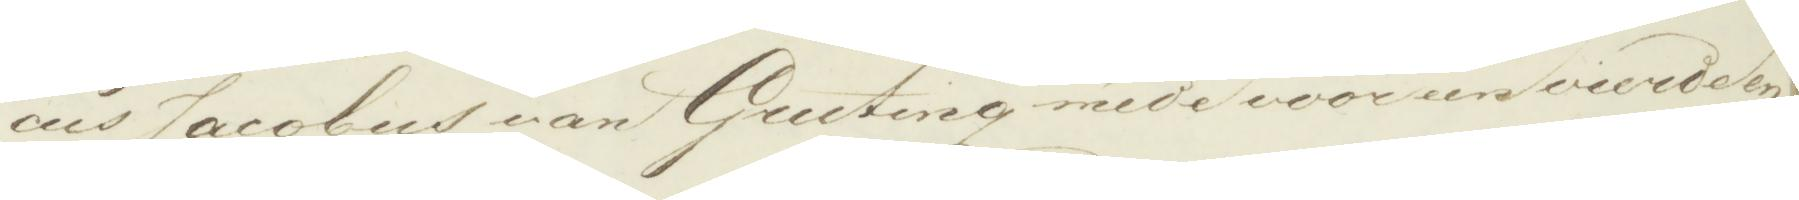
cus Jacobus van Gruting mede voor een vierde en
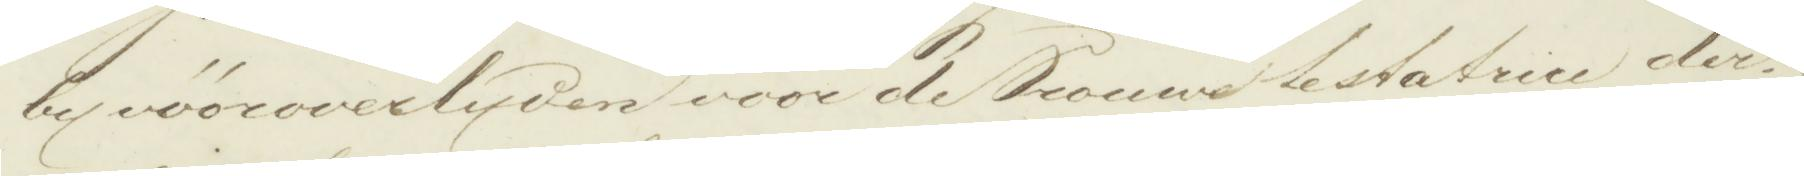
by vóóroverlyden voor de Vrouwe testatrice, der„
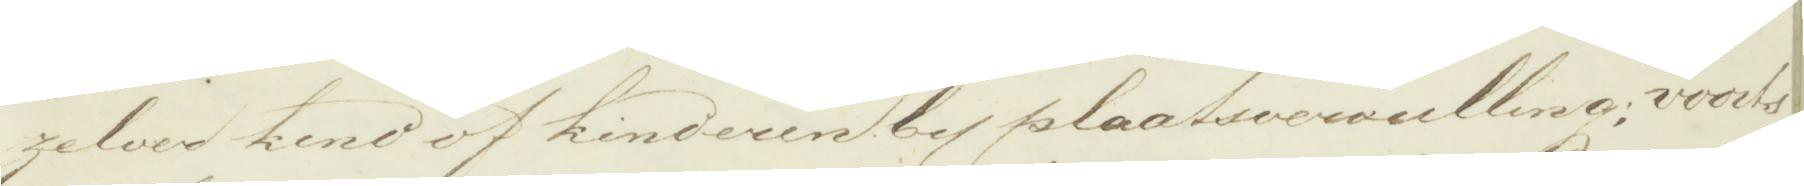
zelver kind of kinderen by plaatsvervulling; voorts
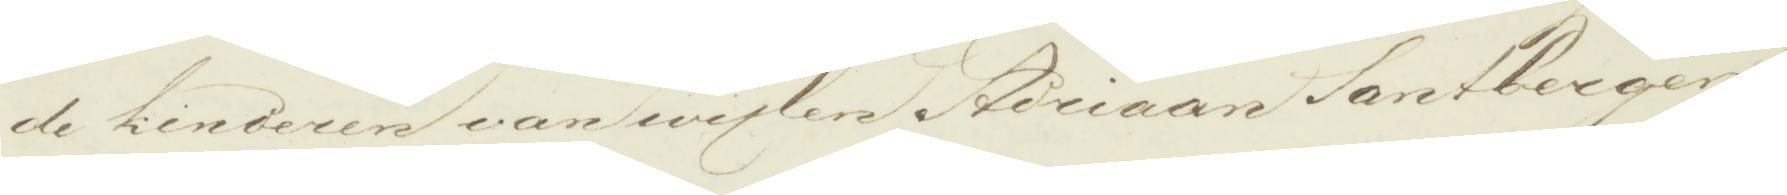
de kinderen van wylen Adriaan Santbergen
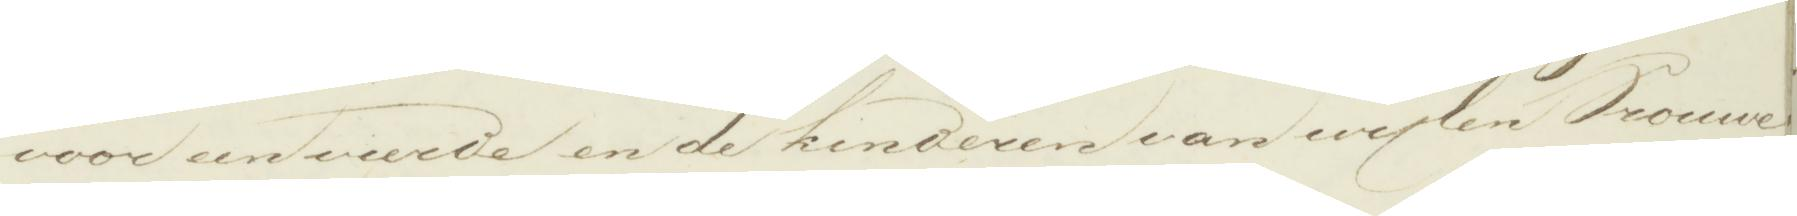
voor een vierde en de kinderen van wylen Vrouwe
